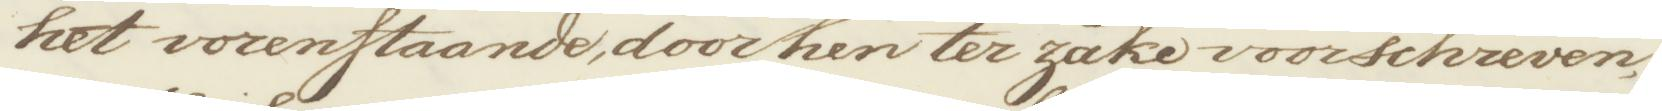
het vorenstaande, door hen ter zake voorschreven,
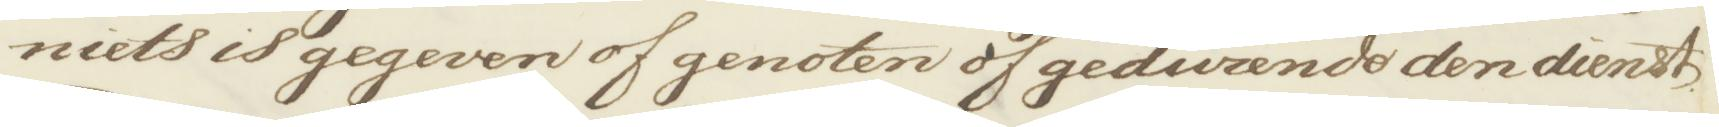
niets is gegeven of genoten of gedurende den dienst.
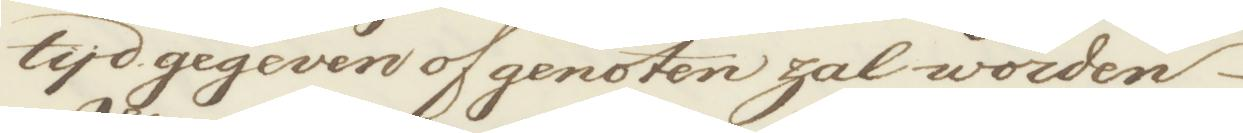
tijd gegeven of genoten zal worden -
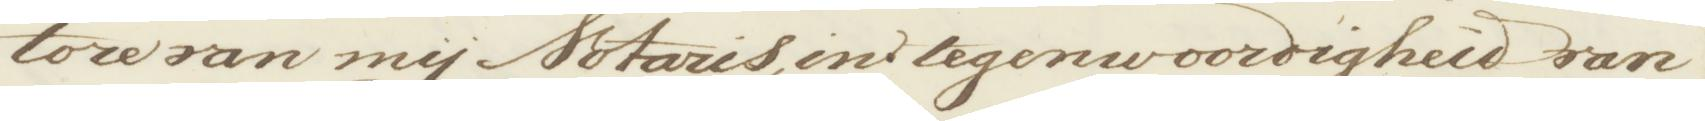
tore van mij Notaris, in tegenwoordigheid van
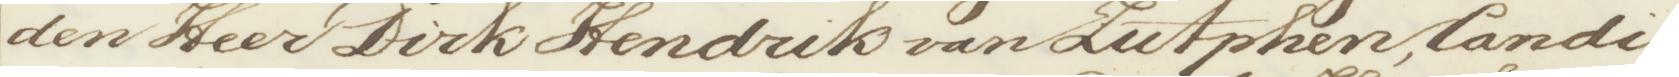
den Heer Dirk Hendrik van Zutphen, Candi
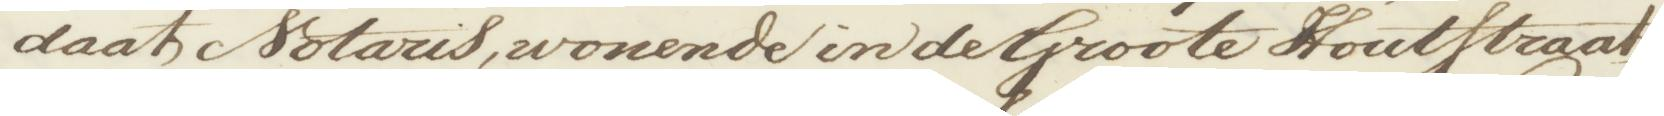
daat Notaris, wonende in de Groote Houtstraat
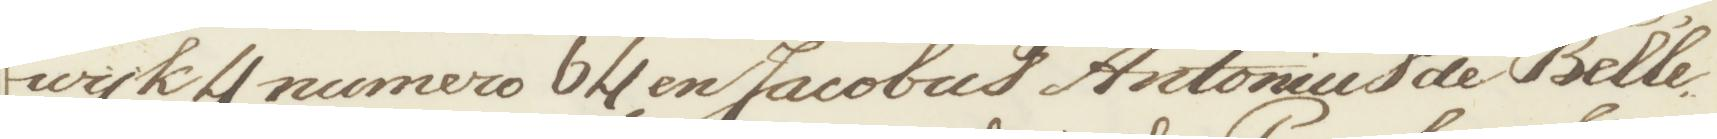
wijk 4 numero 64 en Jacobus Antonius de Belle„
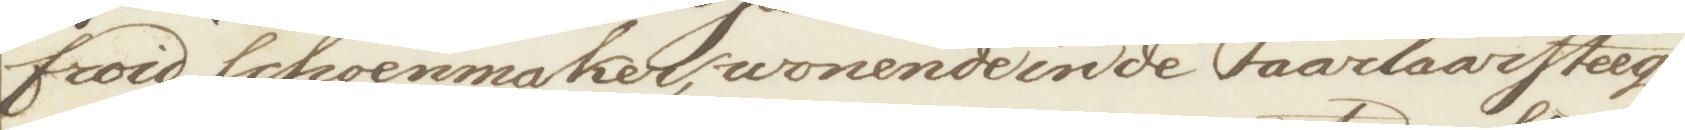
froid schoenmaker, wonende in de Paarlaarsteeg,
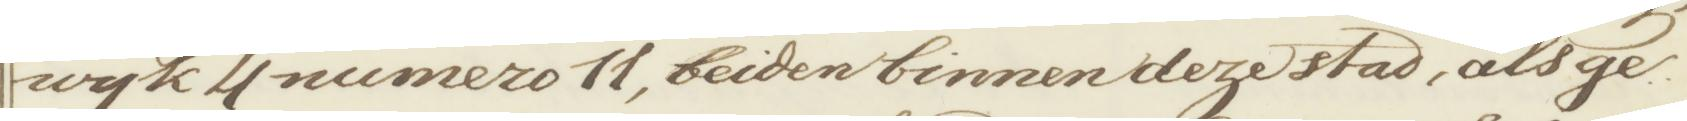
wijk 4 numero 11, beiden binnen deze stad, als ge„
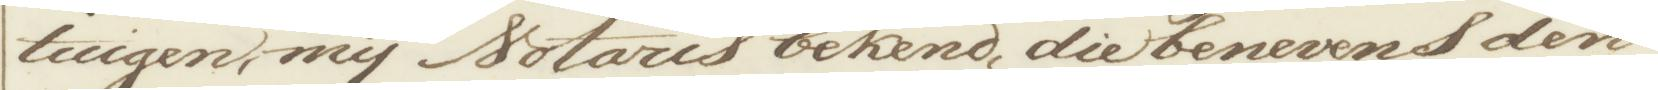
tuigen, mij Notaris bekend, die benevens den
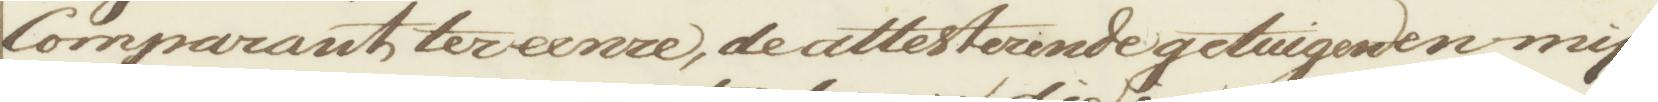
Comparant ter eenre, de attesterende getuigen en mij
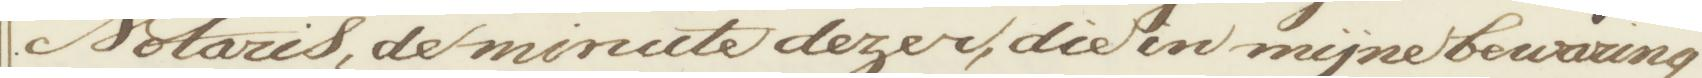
Notaris, de minute dezer, die in mijne bewaring
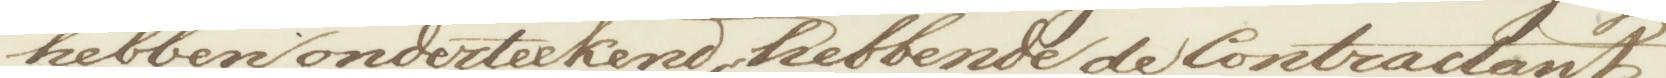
hebben onderteekend, hebbende de Contractant
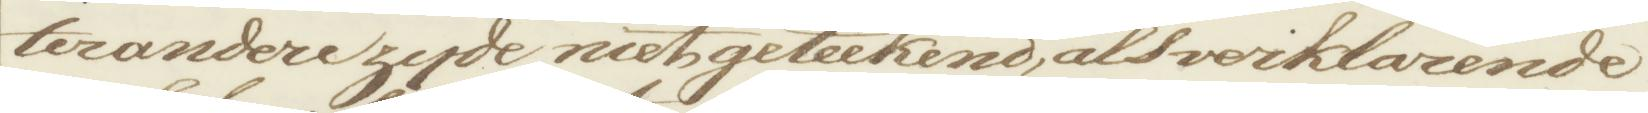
ter andere zyde niet geteekend, als verklarende
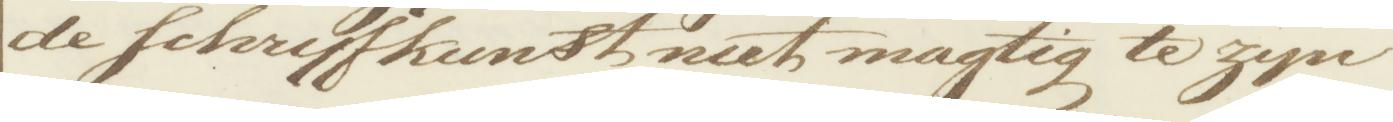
de schrijfkunst niet magtig te zijn
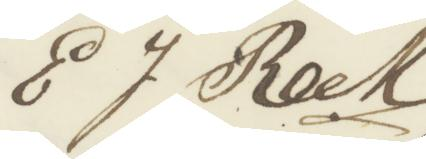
E J Reek
